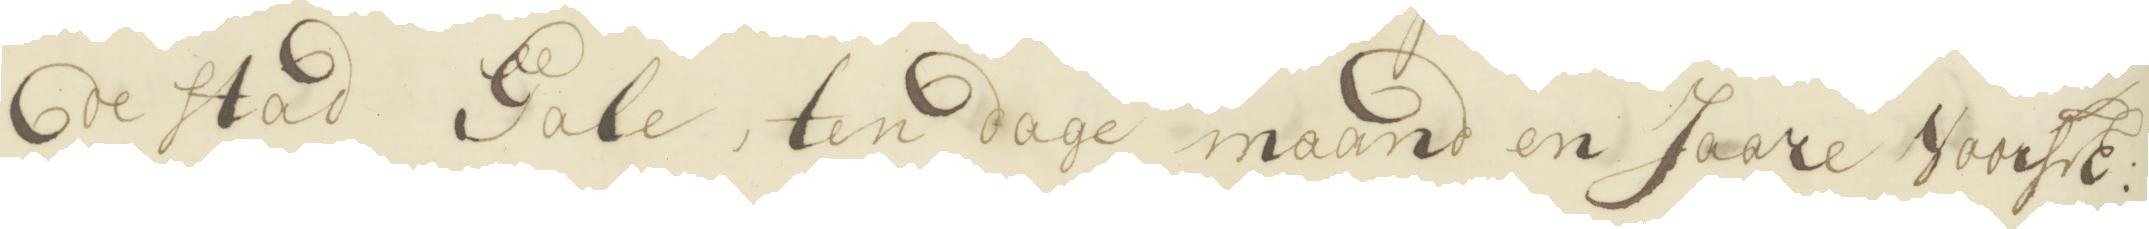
de stad Gale, ten dage maand en Jaare voorsch:
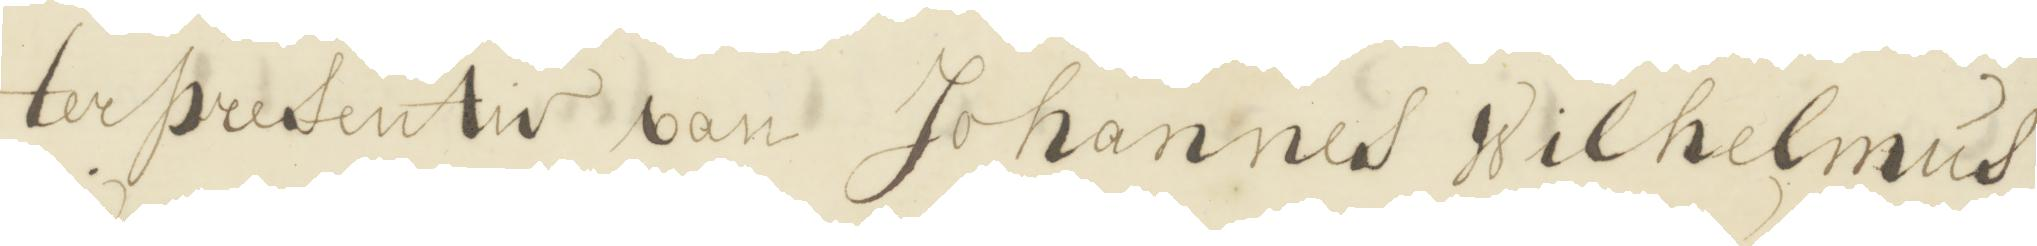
ter presentie van Johannes Wilhelmus
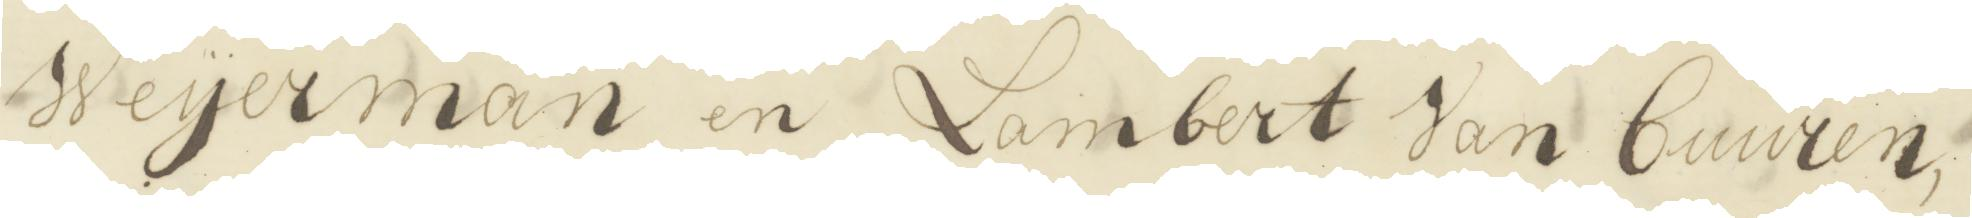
Weijerman en Lambert van buuren,
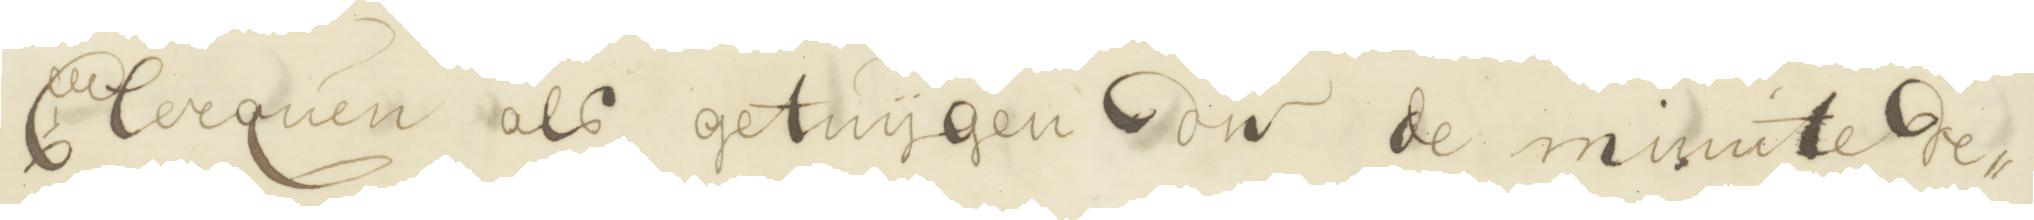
Clerquen als getuijgen die de minute de„
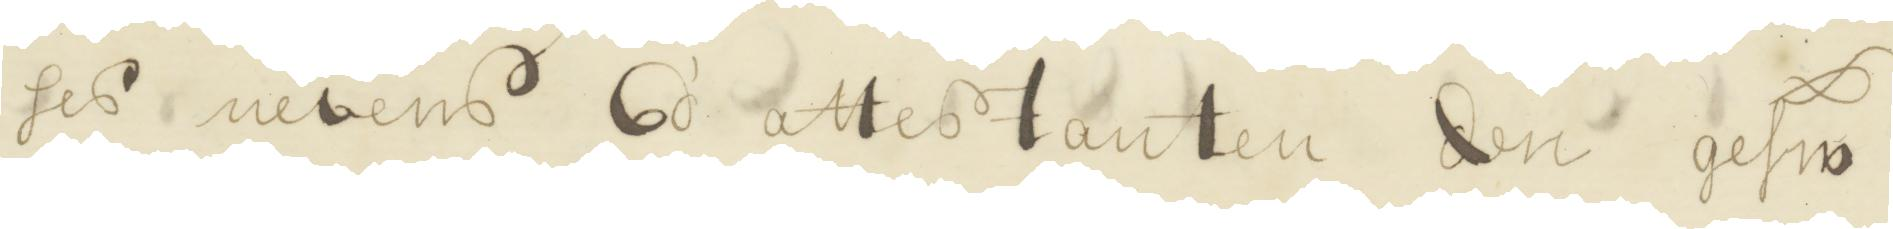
ses nevens d' attestanten den gesw
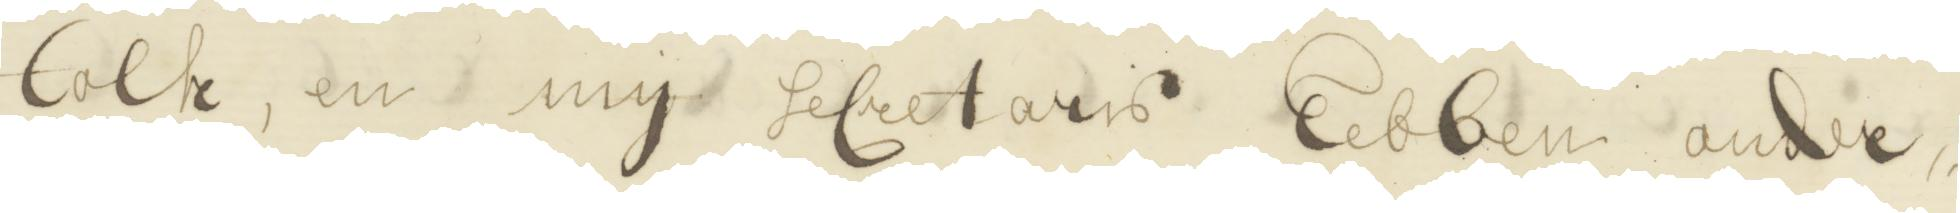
tolk, en mij secretaris hebben onder„
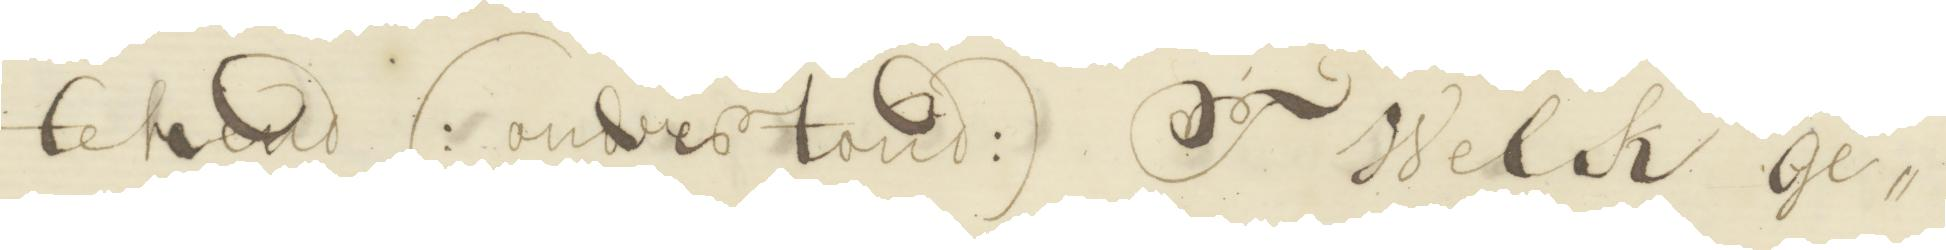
tekend (: onderstond :) T Welk ge„
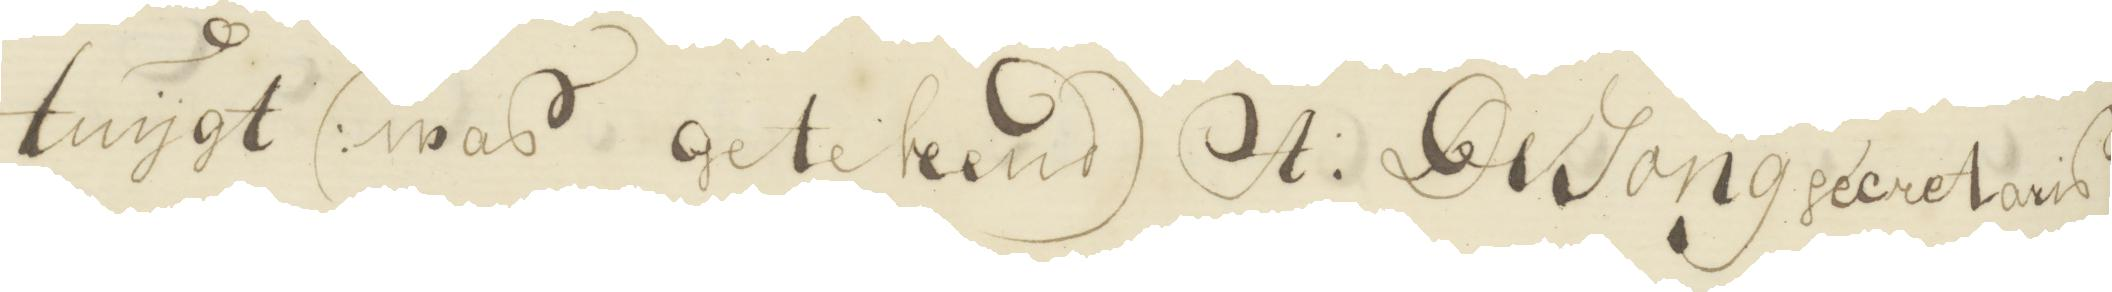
tuijgt (:was getekend) A: De Iong secretaris
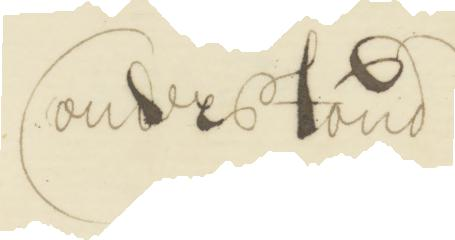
(onder stond)
